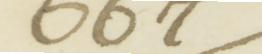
667
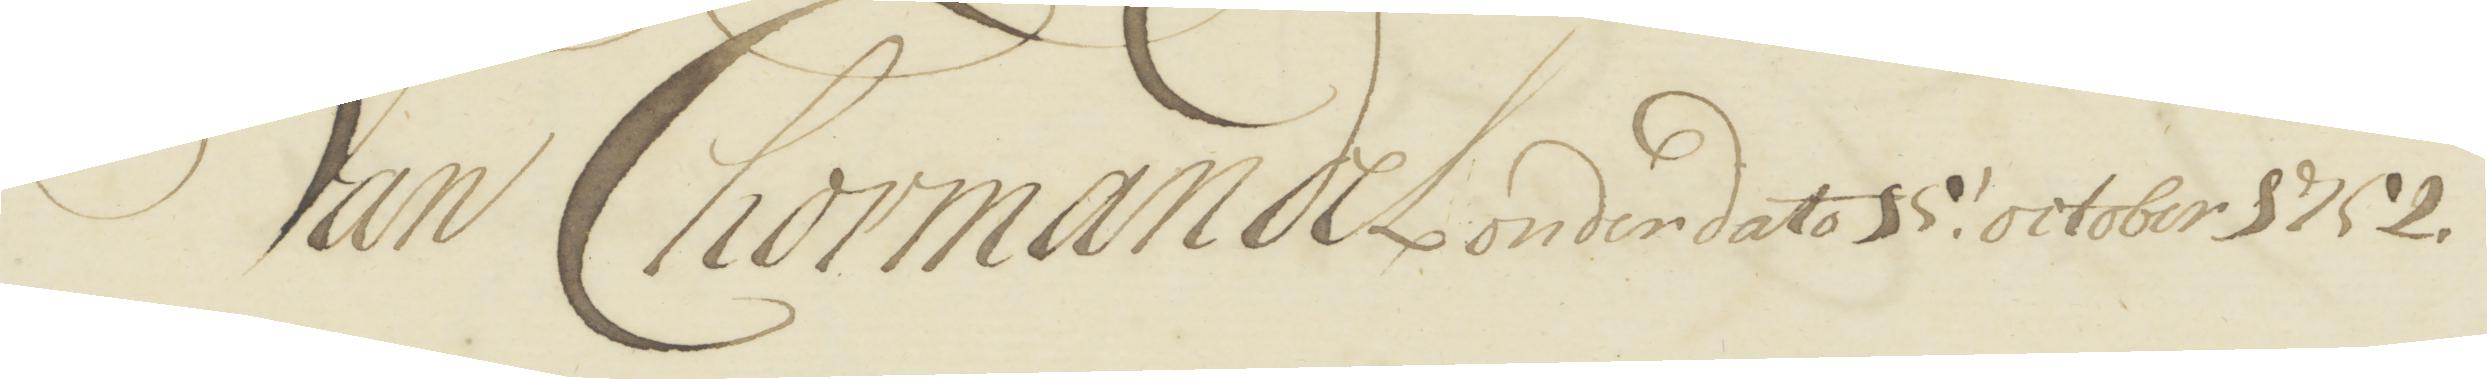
Van Chormandel onder dato 15:' october 1752.
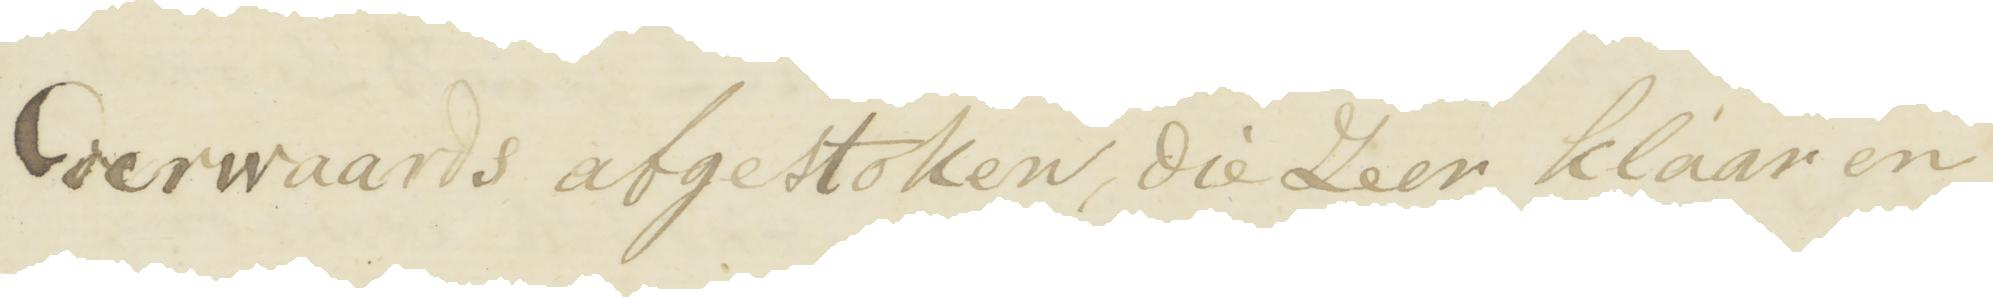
derwaards afgestoken, die zeer klaar en
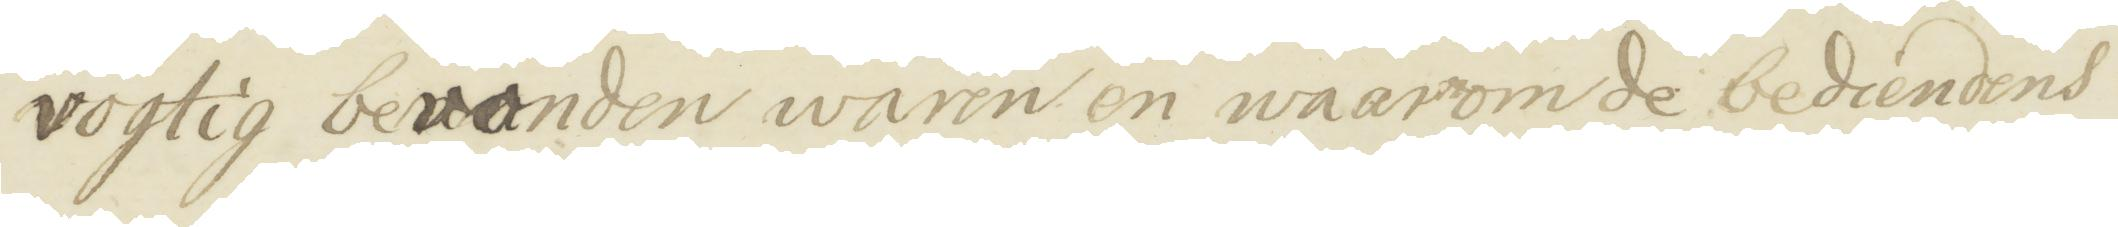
vogtig bevonden waren en waarom de bediendens
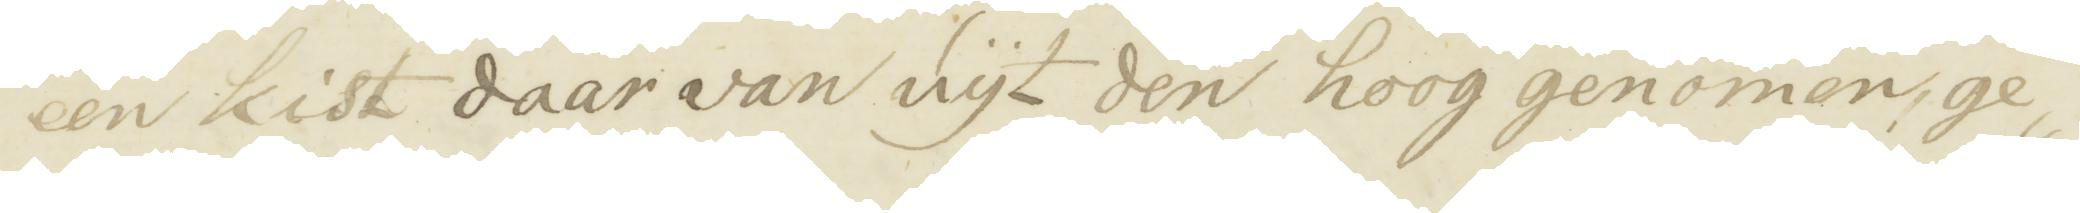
een kist daar van uijt den hoog genomen, ge„
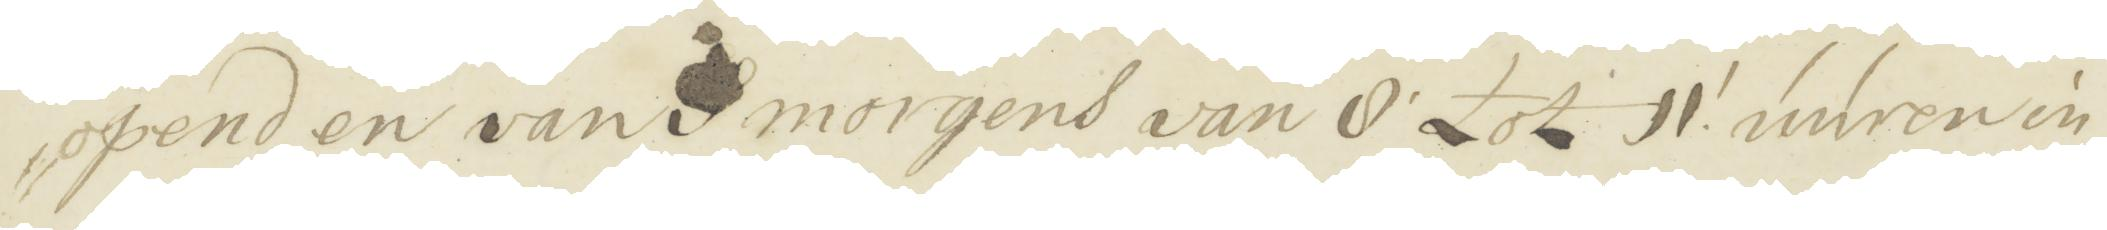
„opend en van 's morgens van 8' tot 11.' uuren in
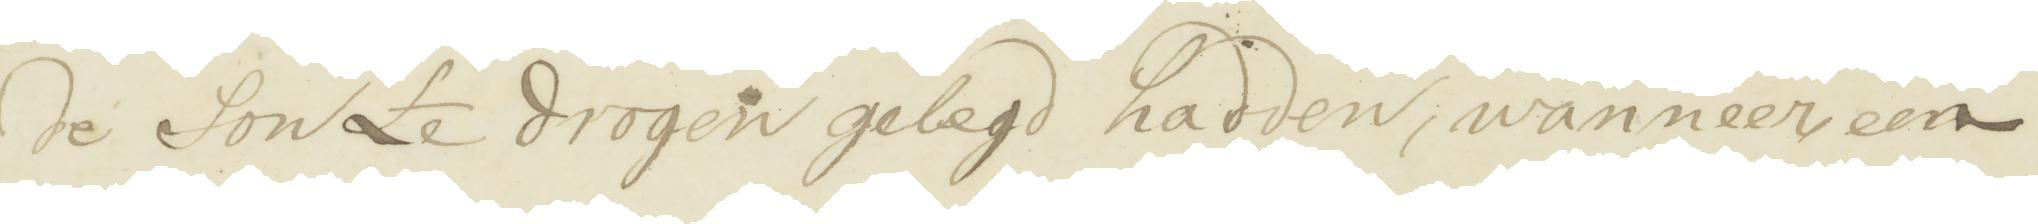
de son te drogen gelegd hadden, wanneer een
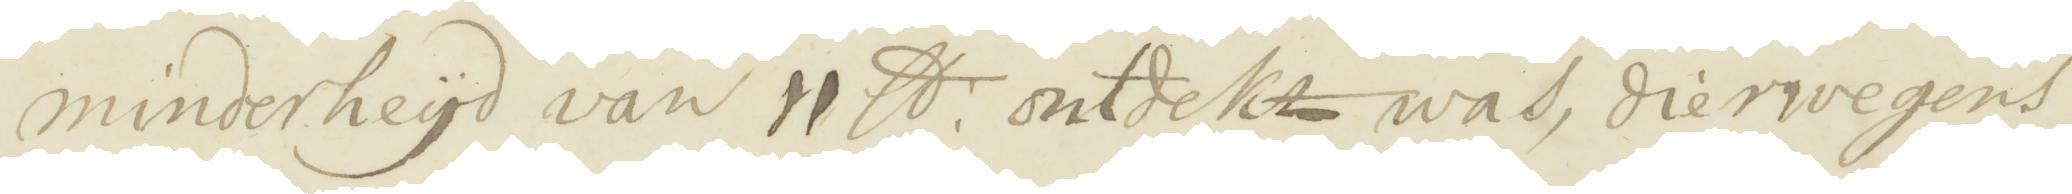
minderheijd van 11 lb: ontdekt was, dierwegens
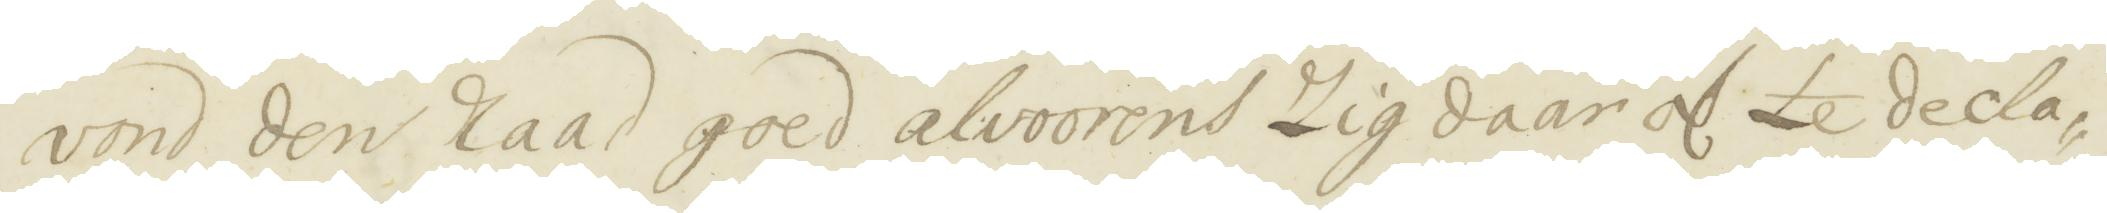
vond den raad goed alvoorens zig daar over te decla„
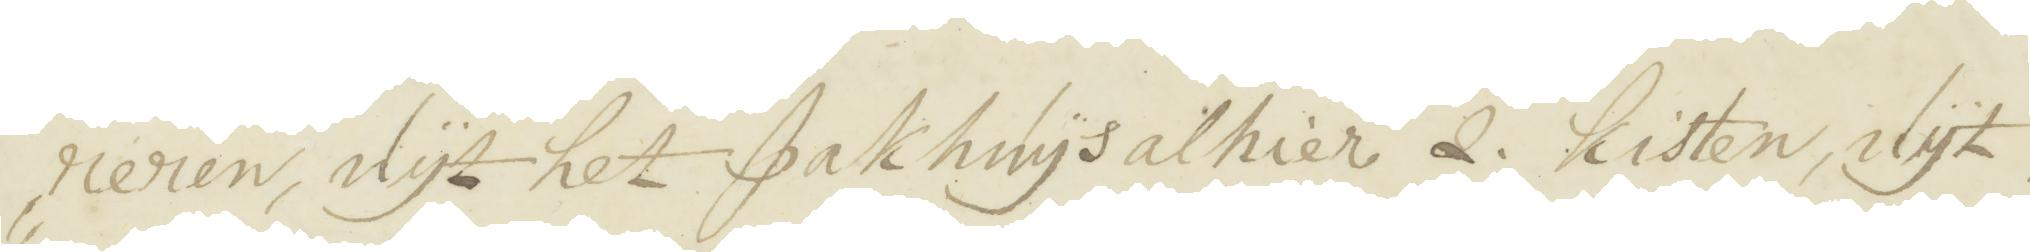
„reren, uijt het pakhuijs alhier 2. kisten, uijt
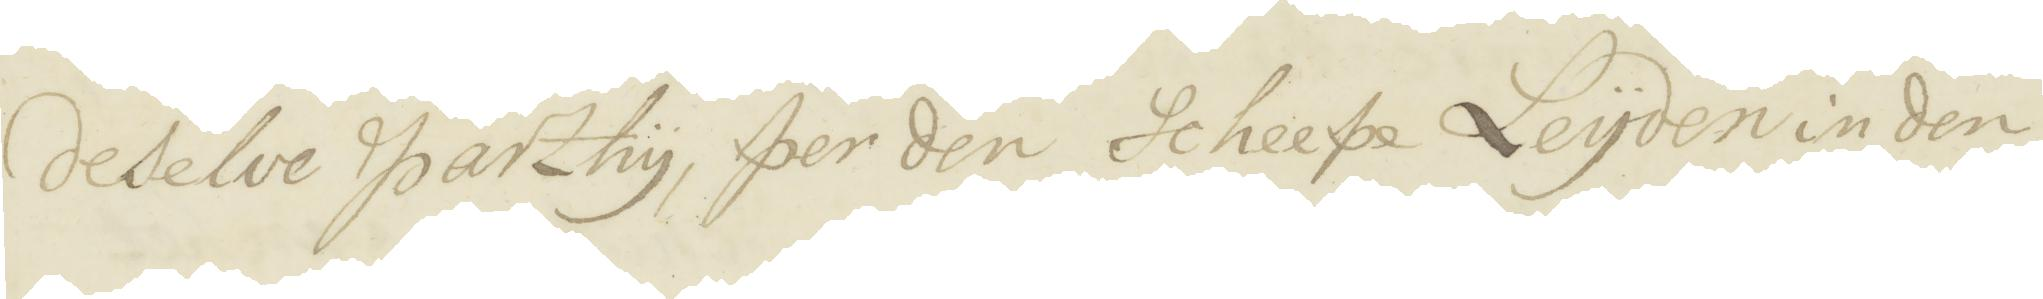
deselve parthij, per den scheepe Leijden in den
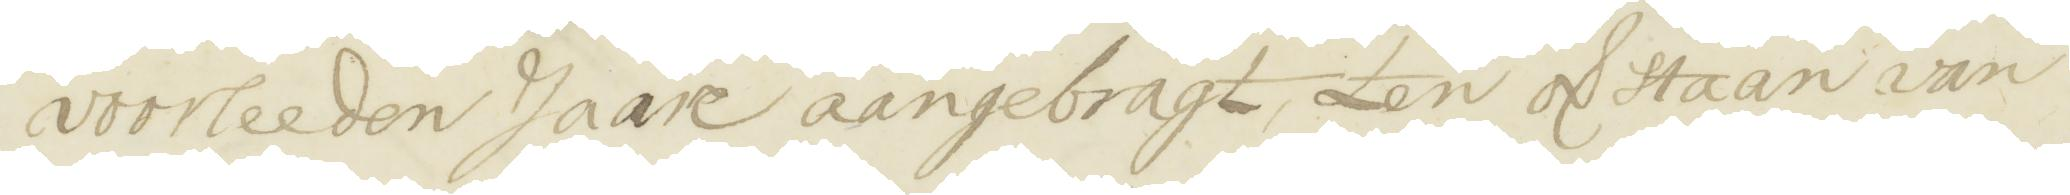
voorleeden Jaare aangebragt, ten overstaan van
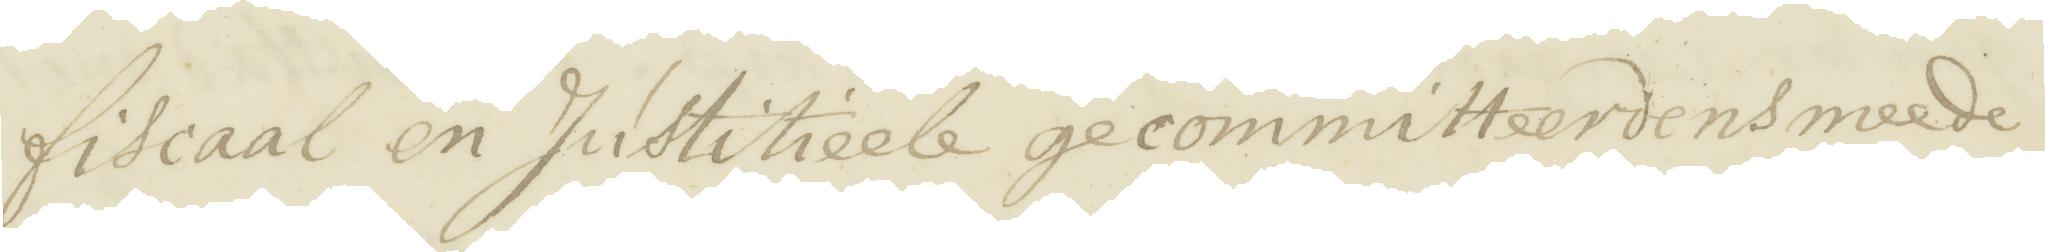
fiscaal en Justitieele gecommitteerdens meede
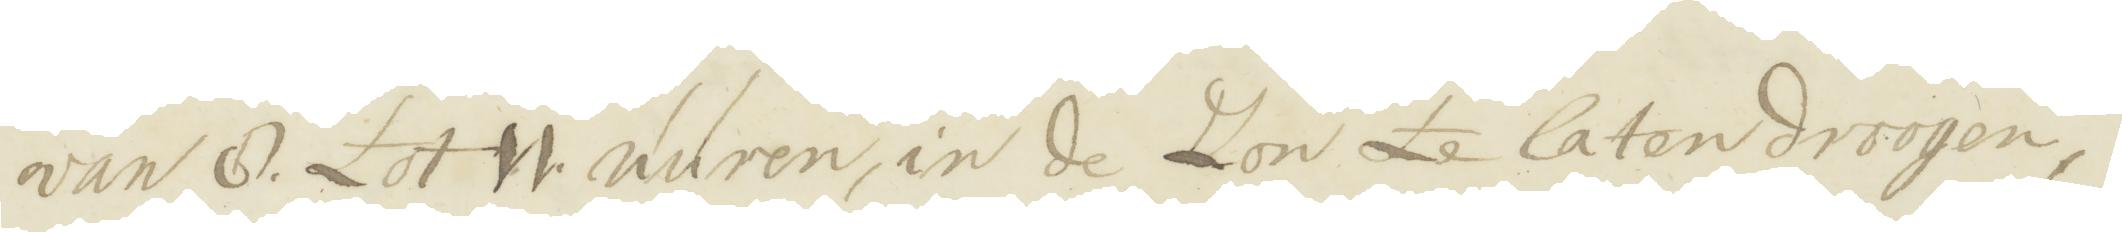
van 8. tot 11. uuren, in de zon te laten droogen,
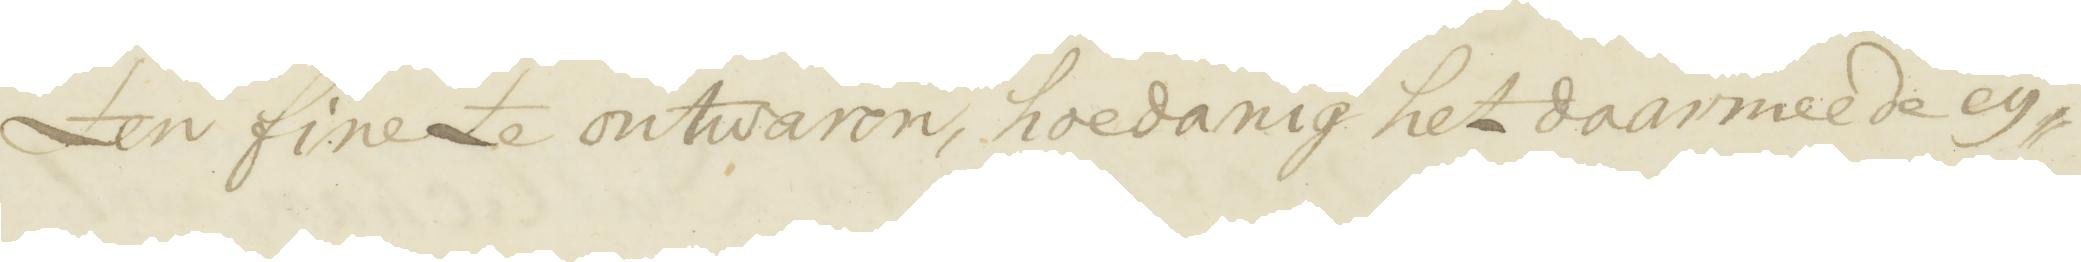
ten fine te ontwaren, hoedanig het daarmee de eij„
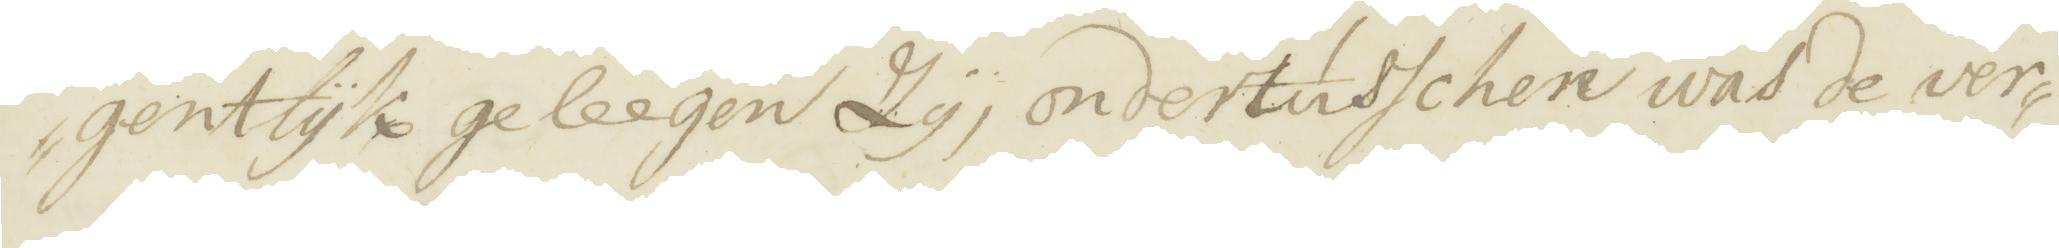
„gentlijk geleegen zij, ondertusschen was de ver„
